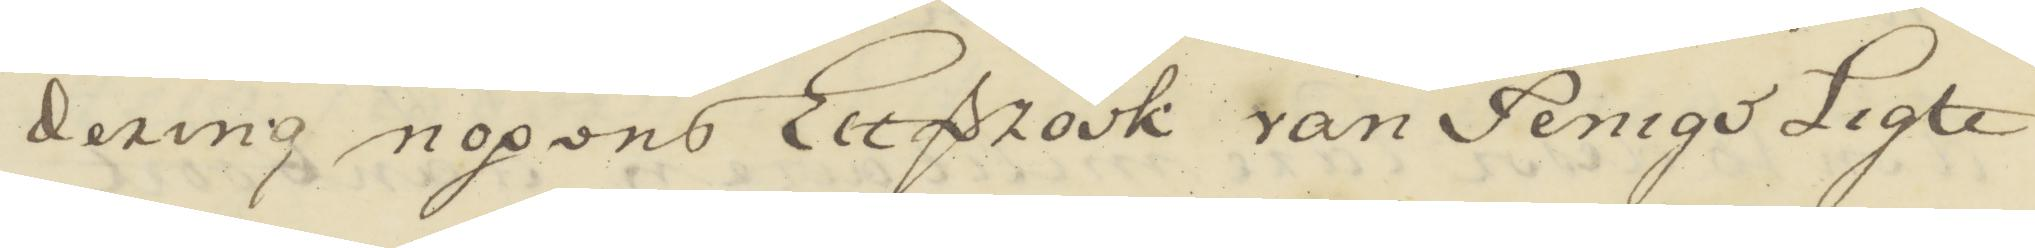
dering nopens het verzouk van Eenige Ligte
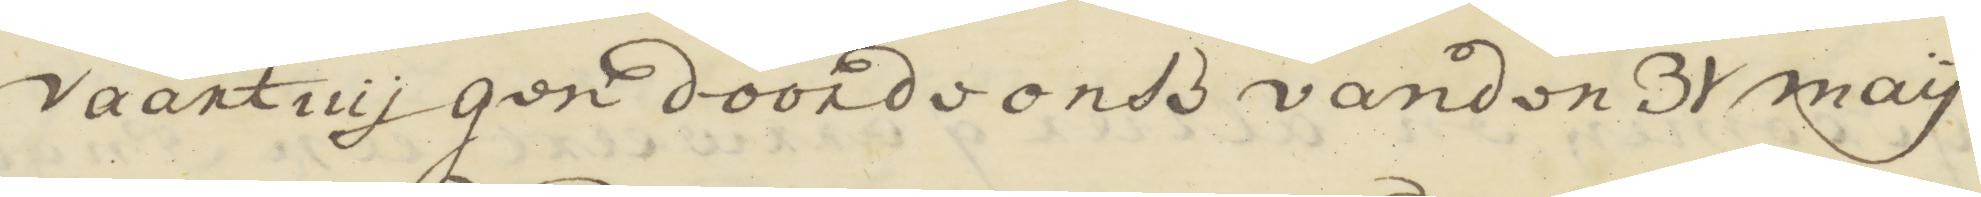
vaartuijgen door de onsen van den 31 maij
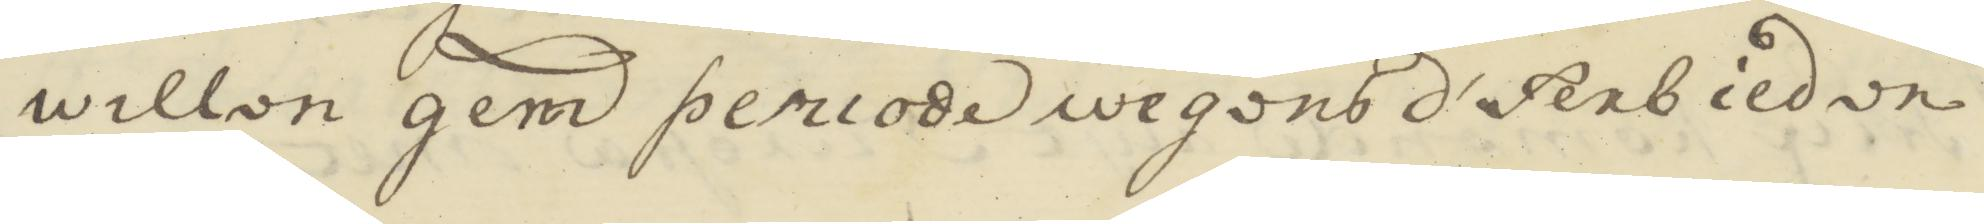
willen gem periode wegens d’Eerbieden
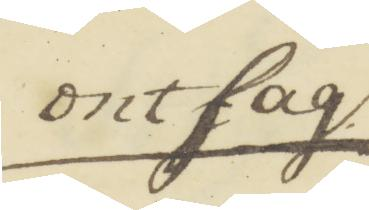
ontsag
